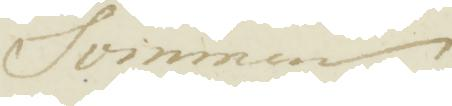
Somma
